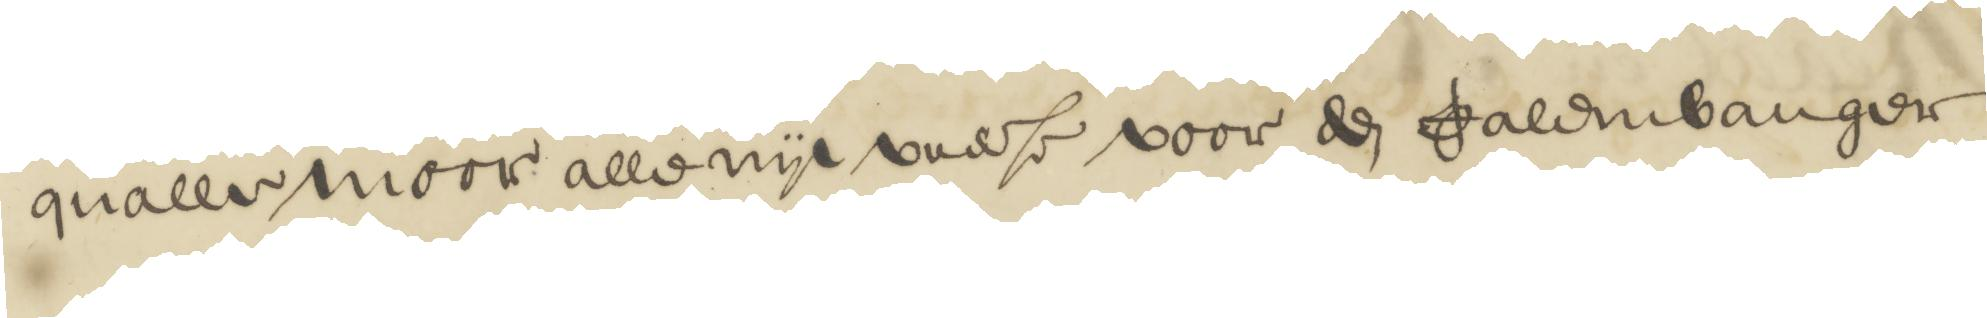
qualle moor alle uijt vreese voor den palembanger
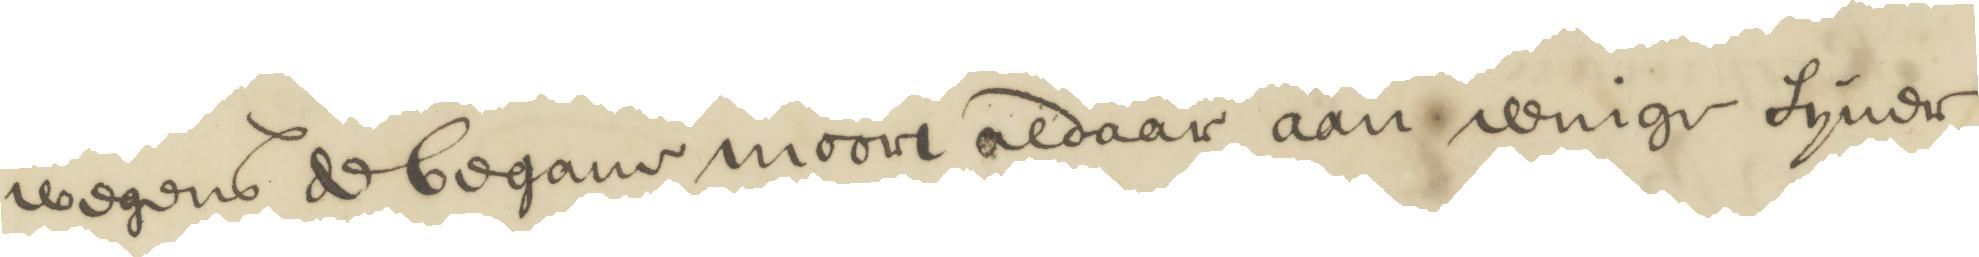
wegens de begane moort aldaar aan eenige sijner
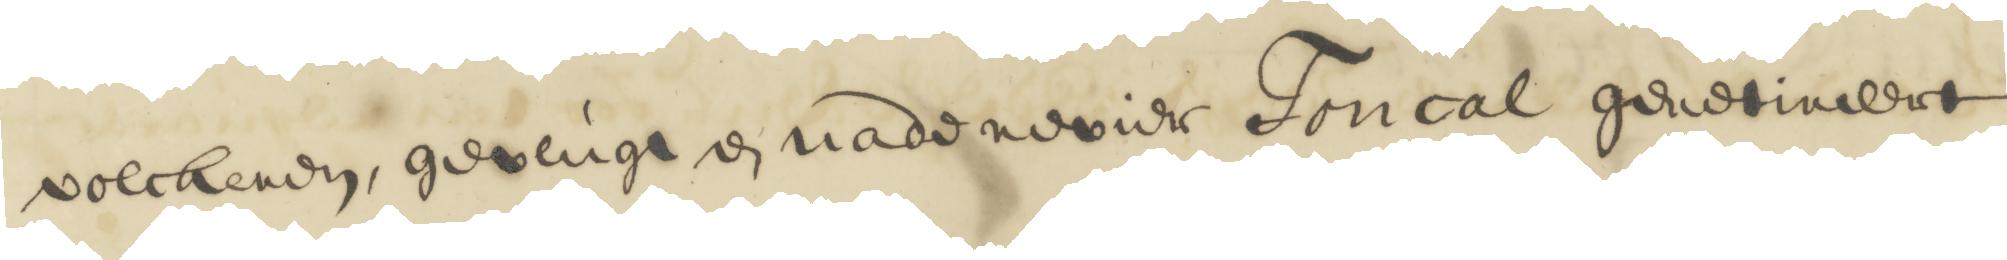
volckeren, gevlugt en nade revier Toncal geretireert
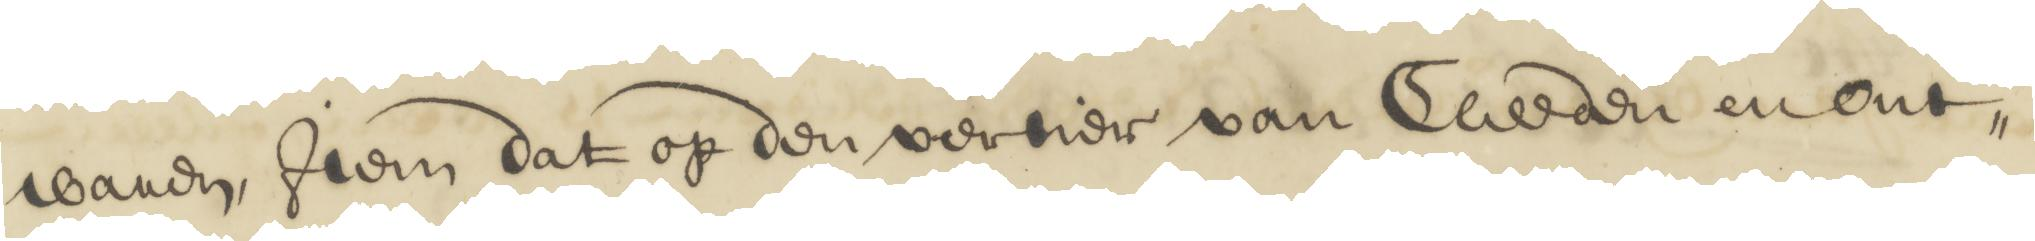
waren, Item dat op den vertier van Cleeden en ont„
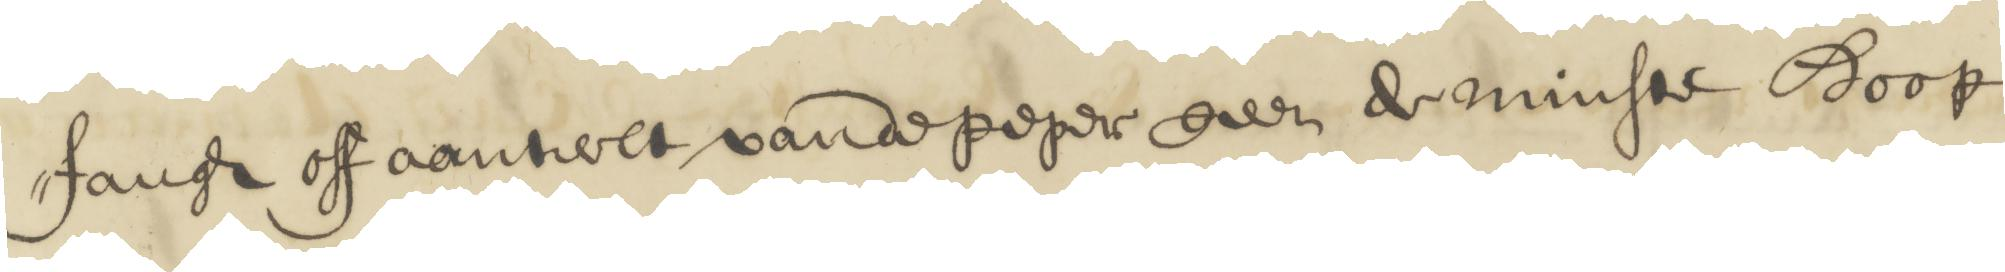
„fangh off aanteelt van de peper geen de minste Hoop
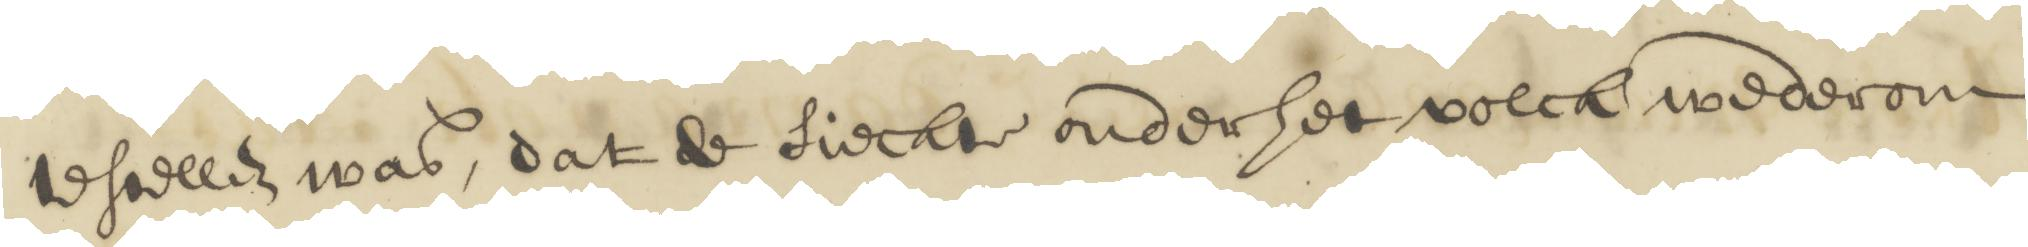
te stellen was, dat de sieckte onder het volck wederom
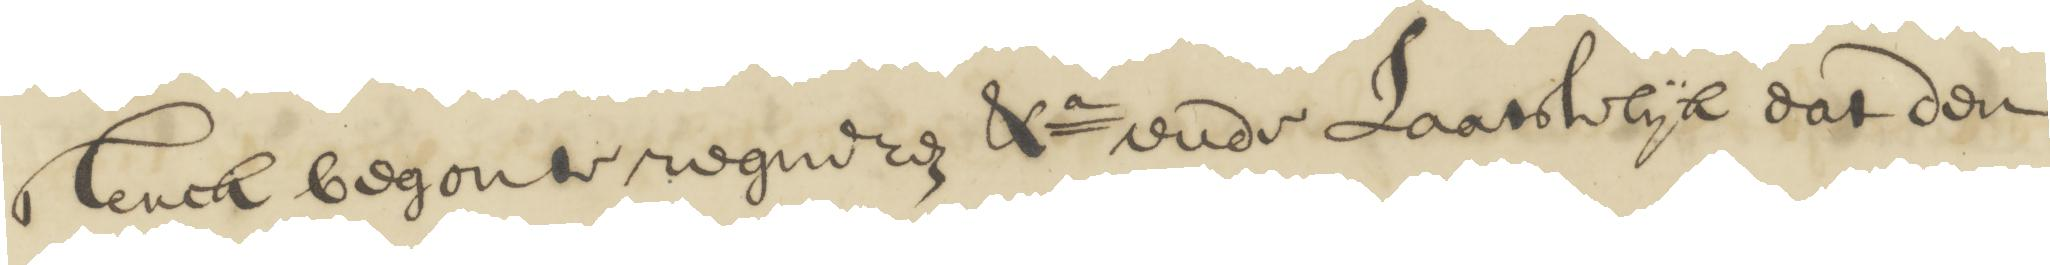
sterck begon te regneren &=a ende Laatstelijk dat den
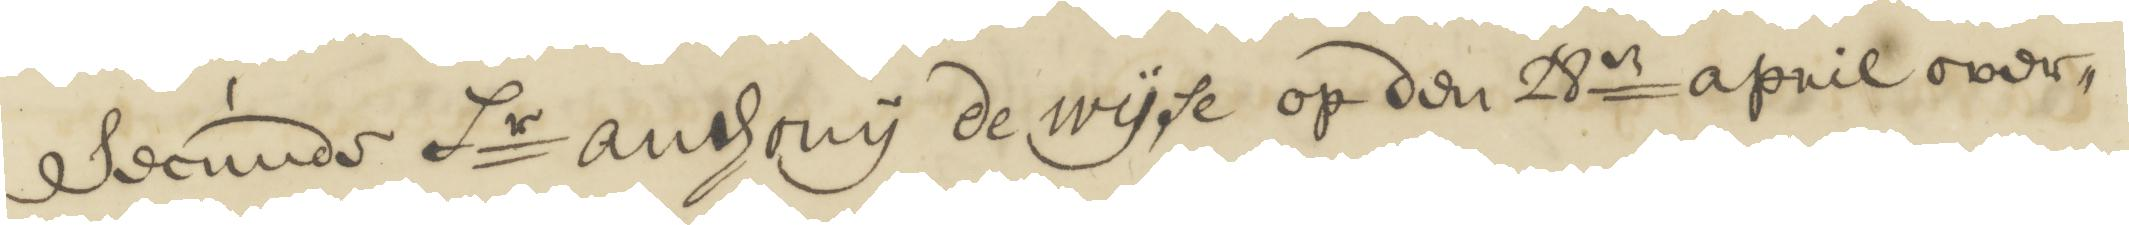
secunde s=r anthonij de wijse op den 28=en april over„
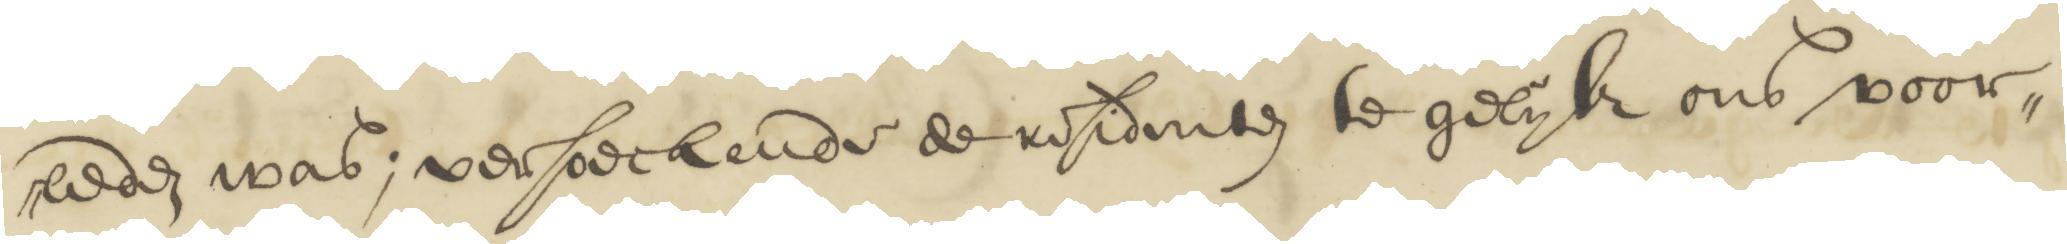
leden was; versoeckende de residenten te gelijk ons voor„
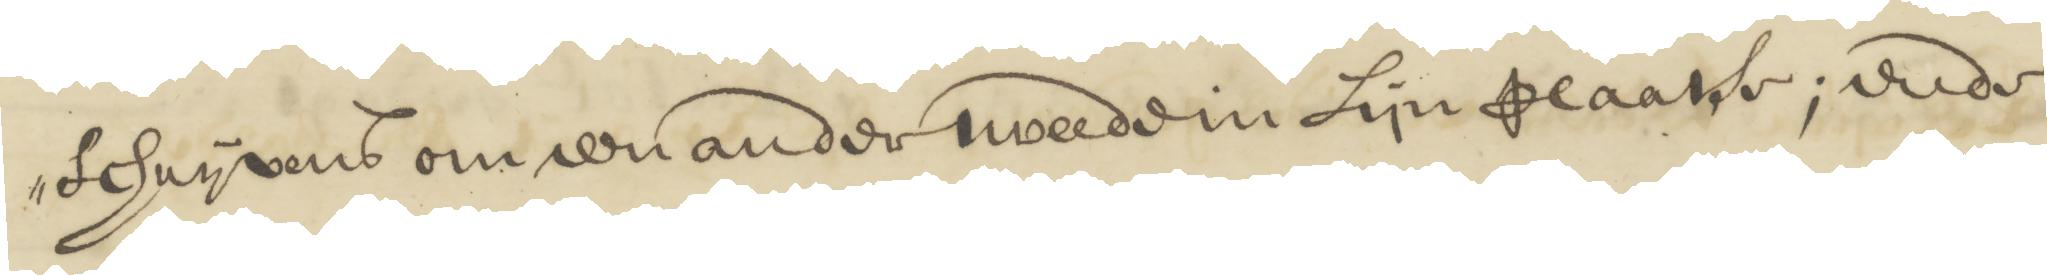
„schrijvens om een ander tweede in sijn plaatse; ende
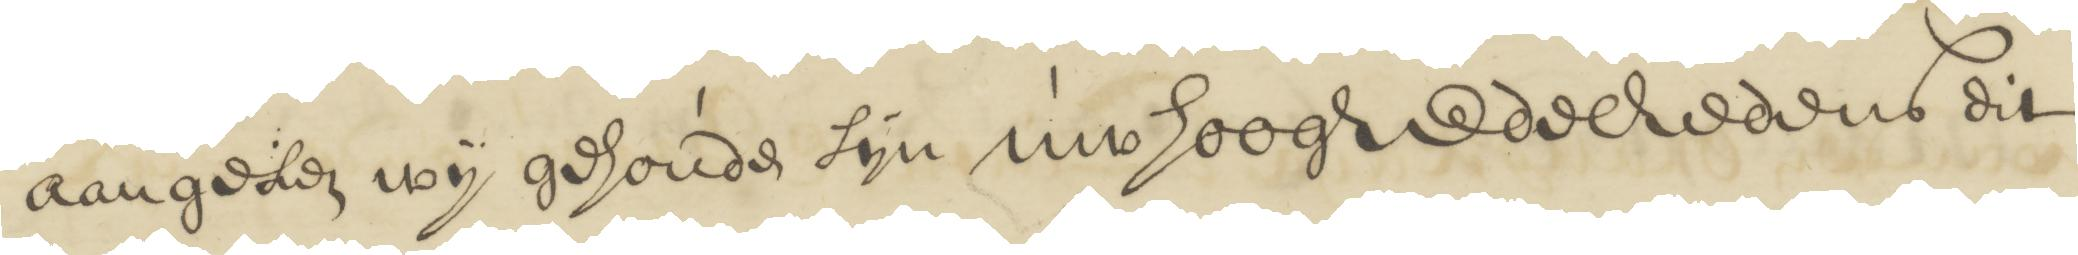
aangesien wij gehouden sijn uw hoogh Edelhedens dit
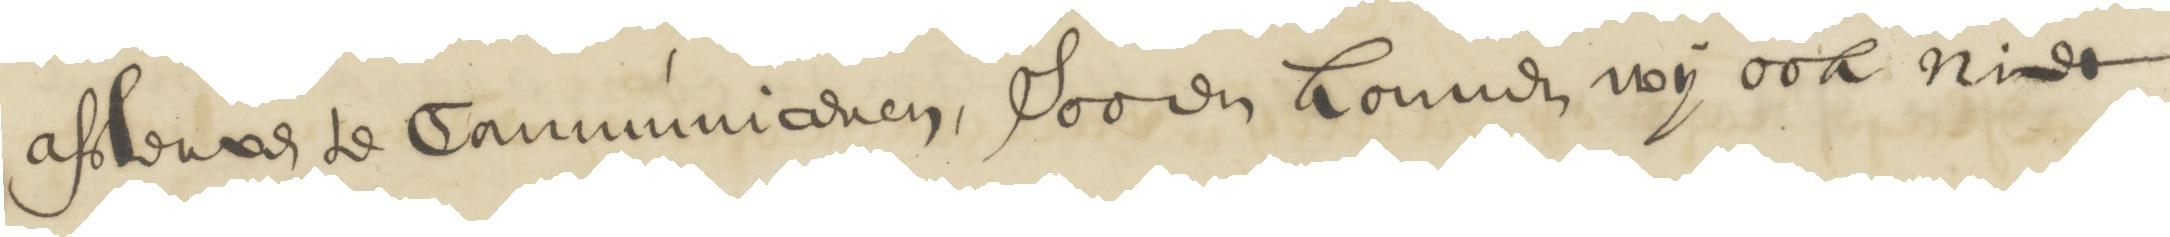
afsterven te Communiceren, soo en konnen wij ook niet
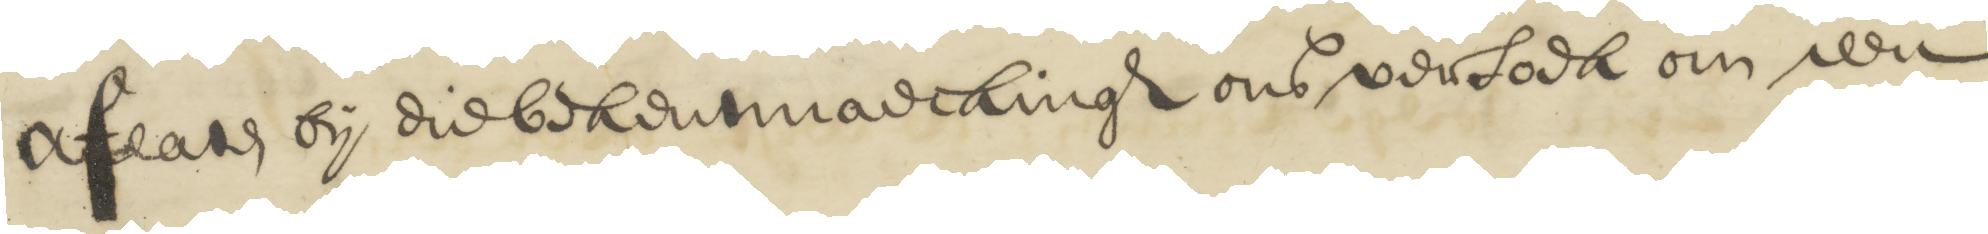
aflaten bij die bekentmaeckingh ons versoek om een
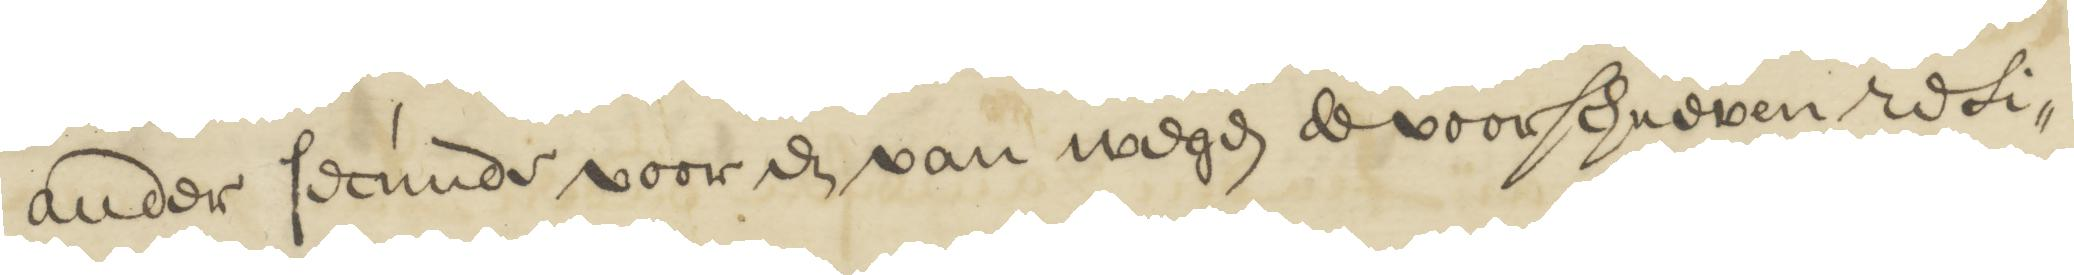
ander secunde voor en van wegen de voorschreven resi„
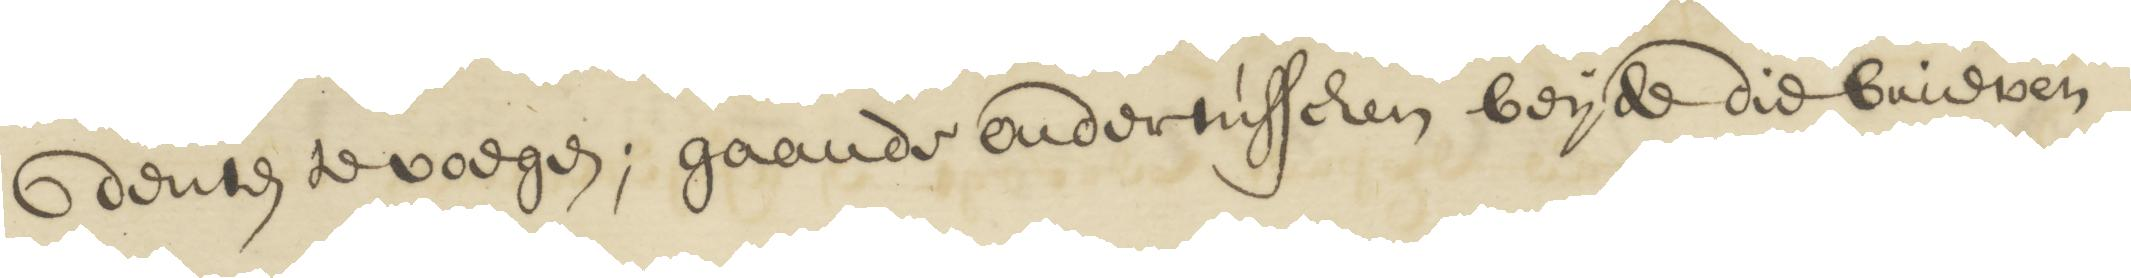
denten te voegen; gaande ondertusschen beijde die brieven
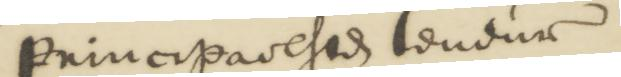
principaelsten teneur
